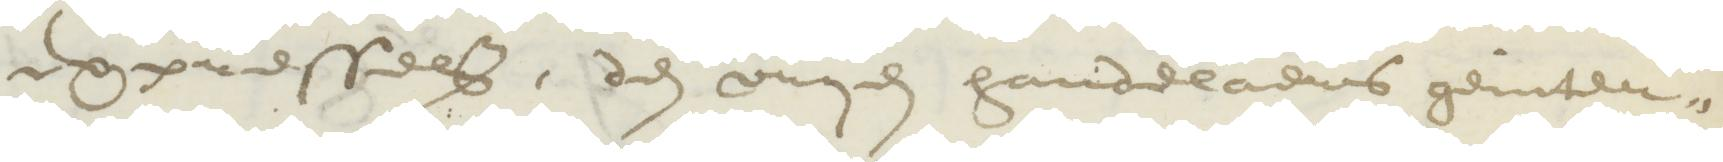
Expresselijk, den vrijen handelaers geinter„
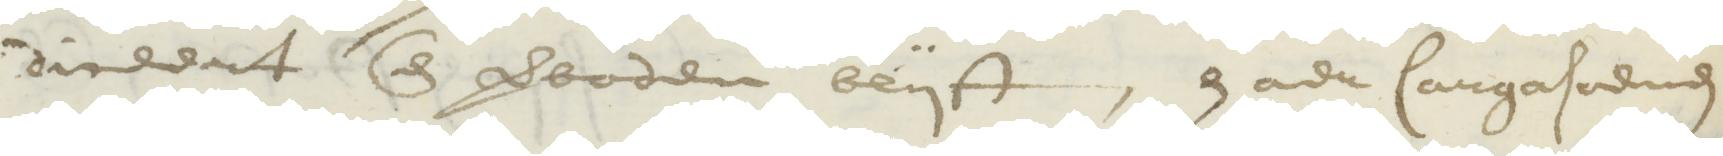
direert ende verboden blijft, haer Cargasoenen
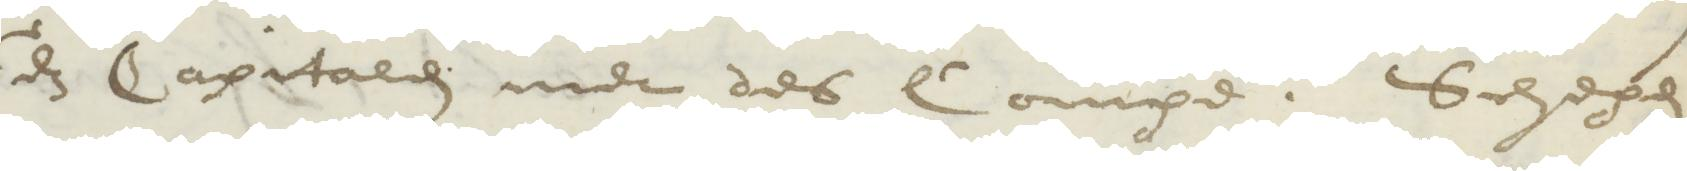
en Capitalen met des Compe.s schepen
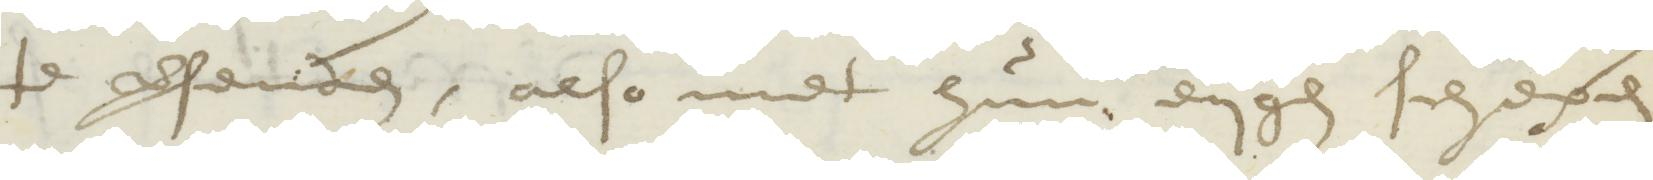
te versenden, also met hun eijgen schepen
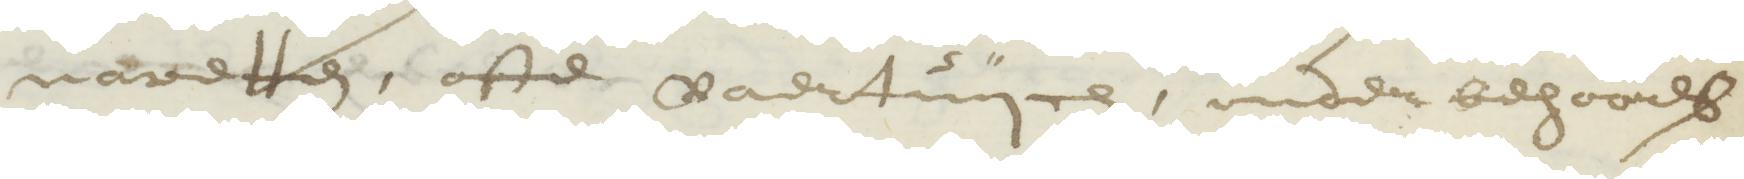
navetten, ofte vaertuijgen, onder behoorlijk
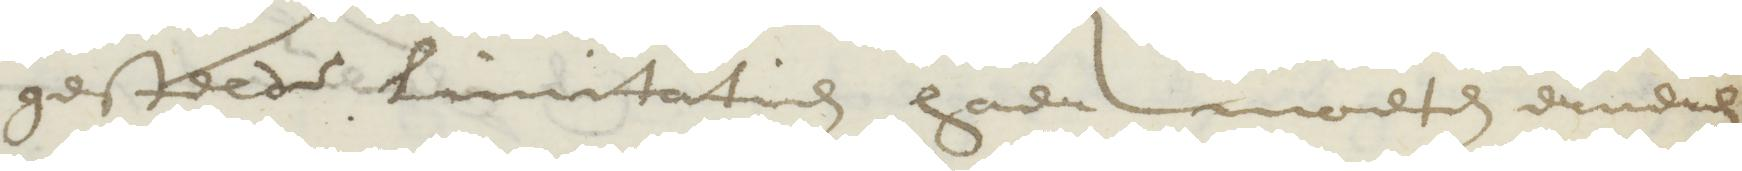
gestelde limitatien haer moeten erneren
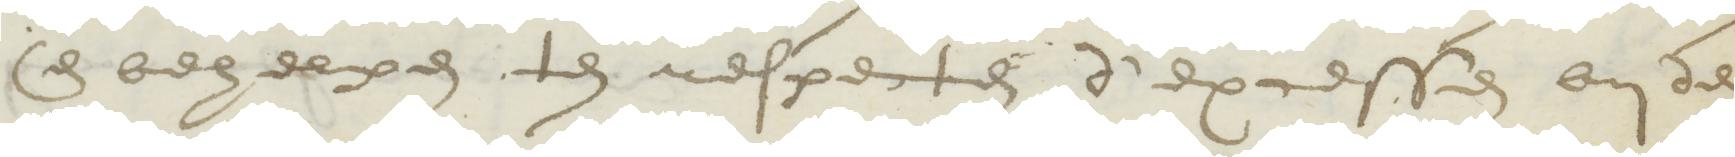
ende behelpen ten respecten d’excessen by den
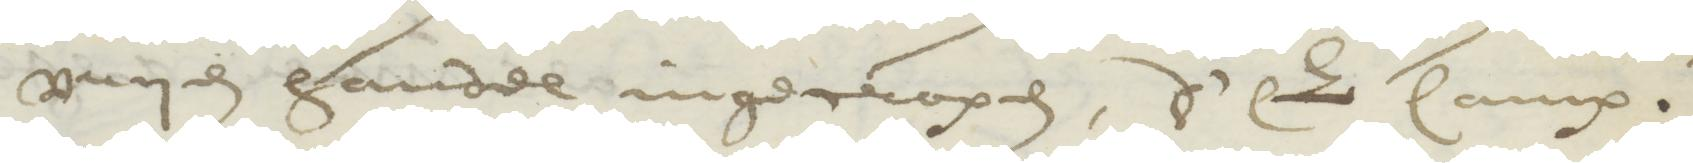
vryen handel ingeslopen, d’ C Comp.
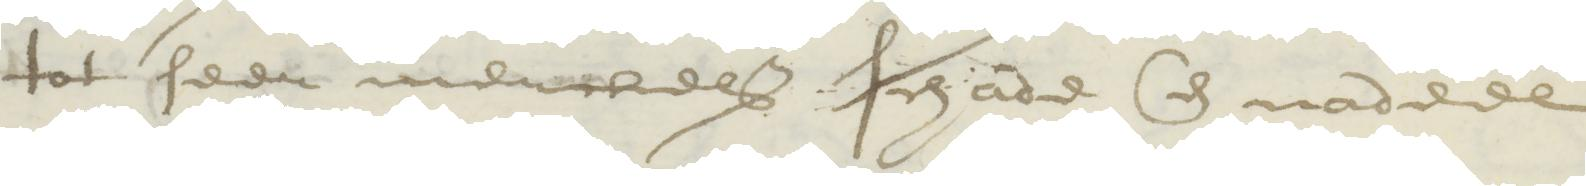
tot seer merwaels schade ende nadeel
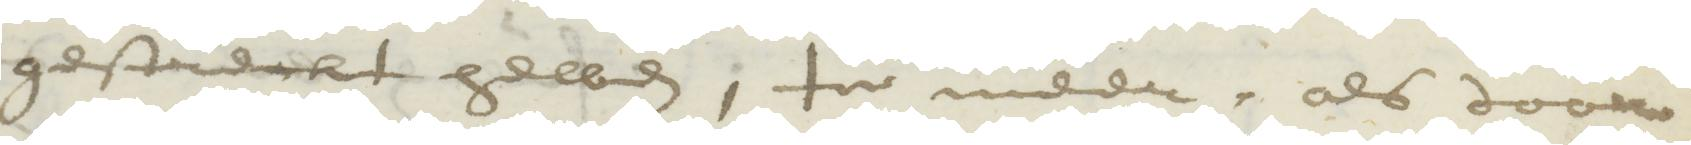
gestreckt hebben, te meer, als door
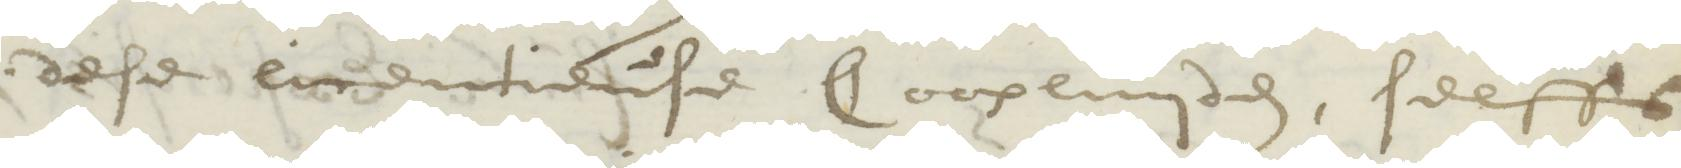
dese licentieuse Coopluyden, selffs
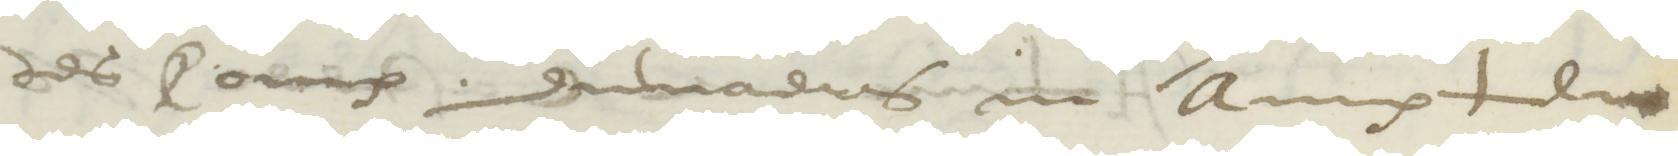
des Comp . dienaers ampten
